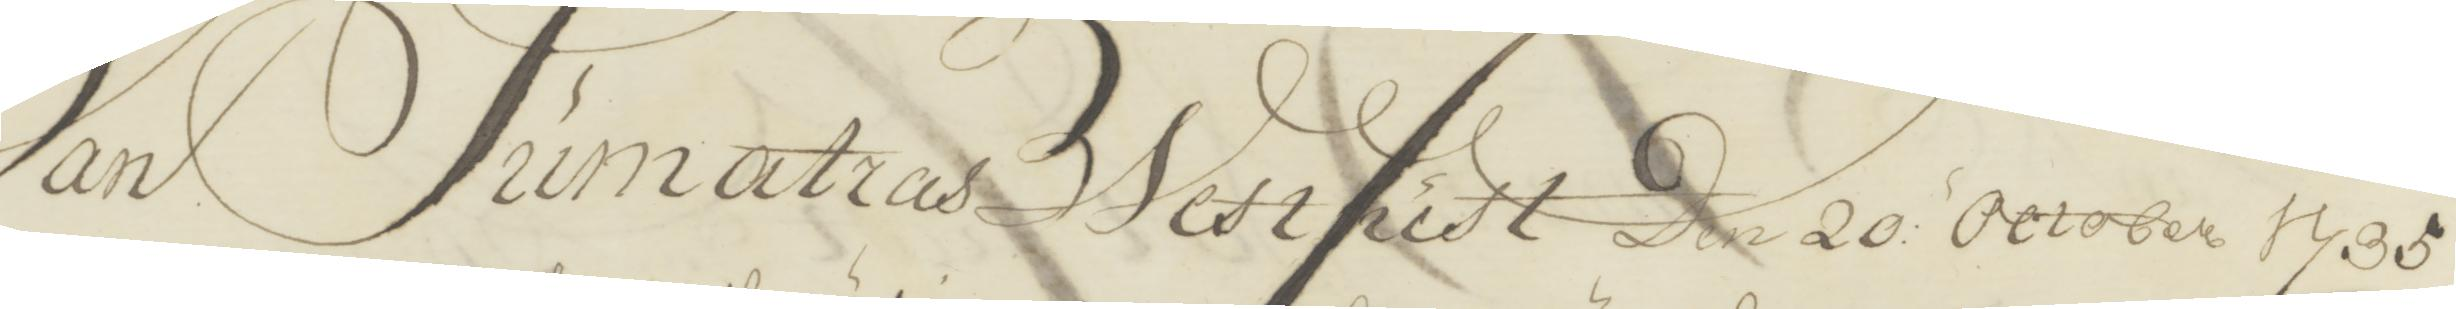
an Sumatras West Cust den 20:' October 1735
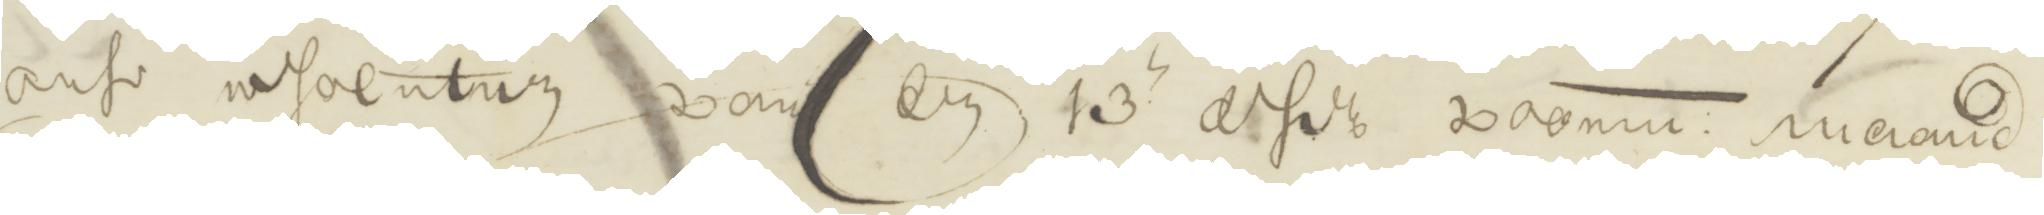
onse resolutien van den 13:' deser voorm: maand
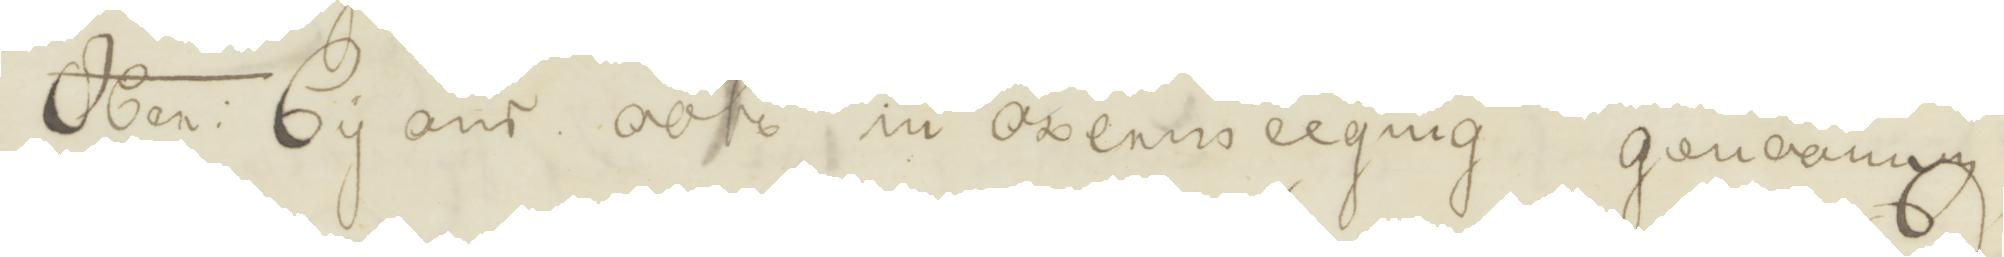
8ber: bij ons ook in overweeging genoomen
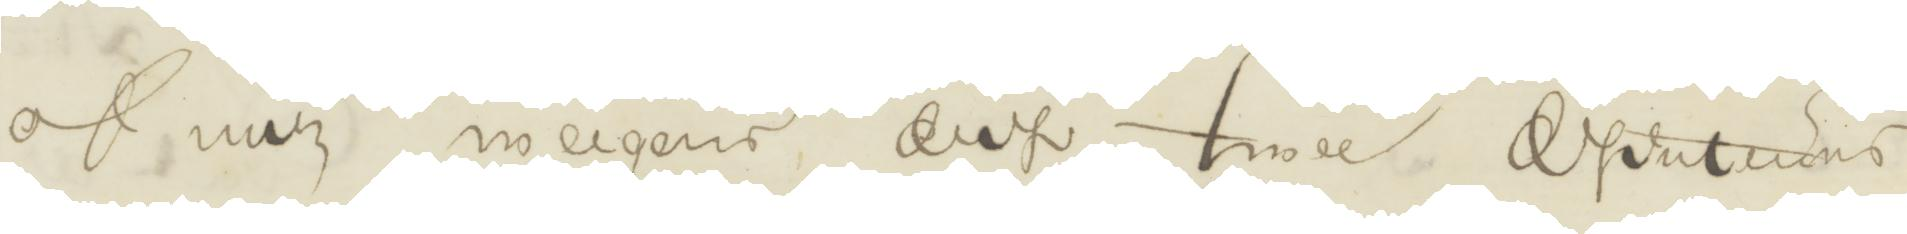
of men weegens deese twee deserteurs
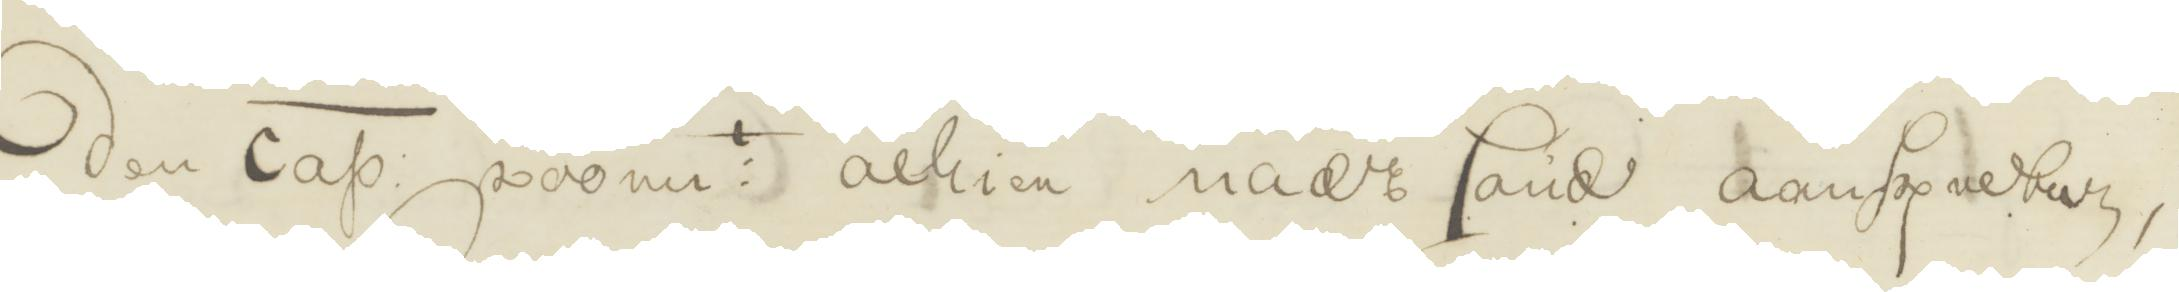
den cap: voorn:t alhier nader soude aanspreken,
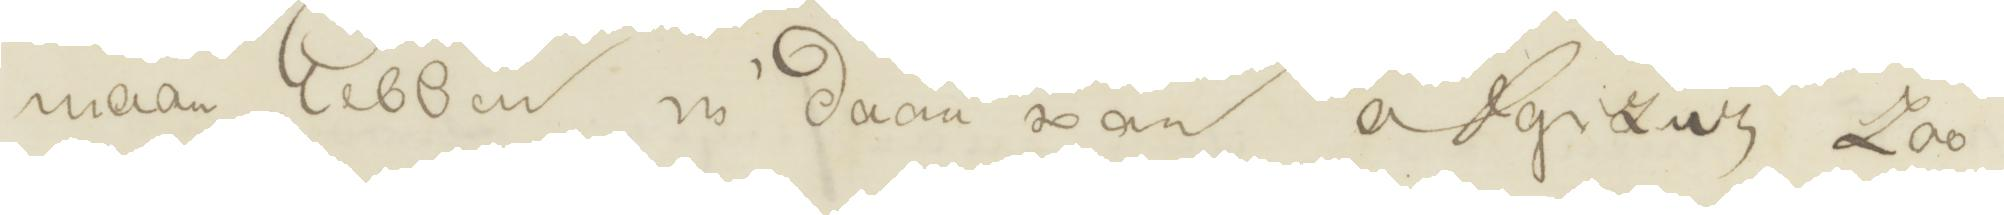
maar hebben w' daar van afgezien zoo
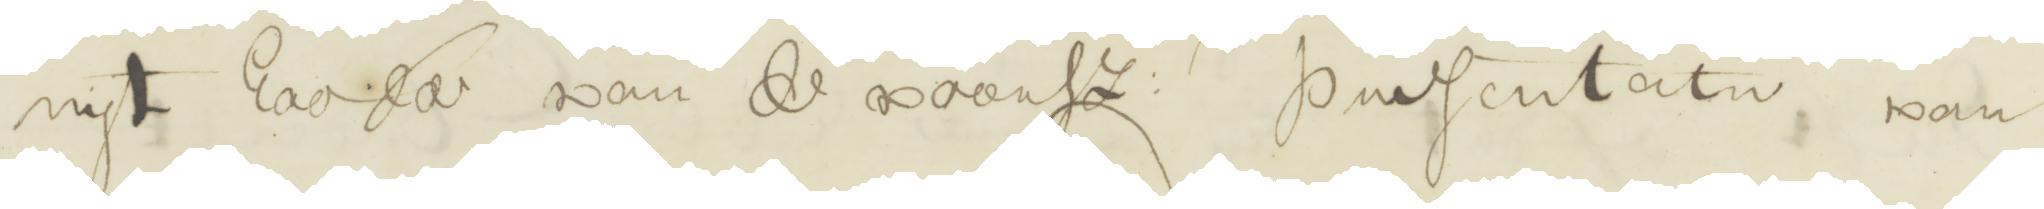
uijt hoofde van de voorsz: presentatie van
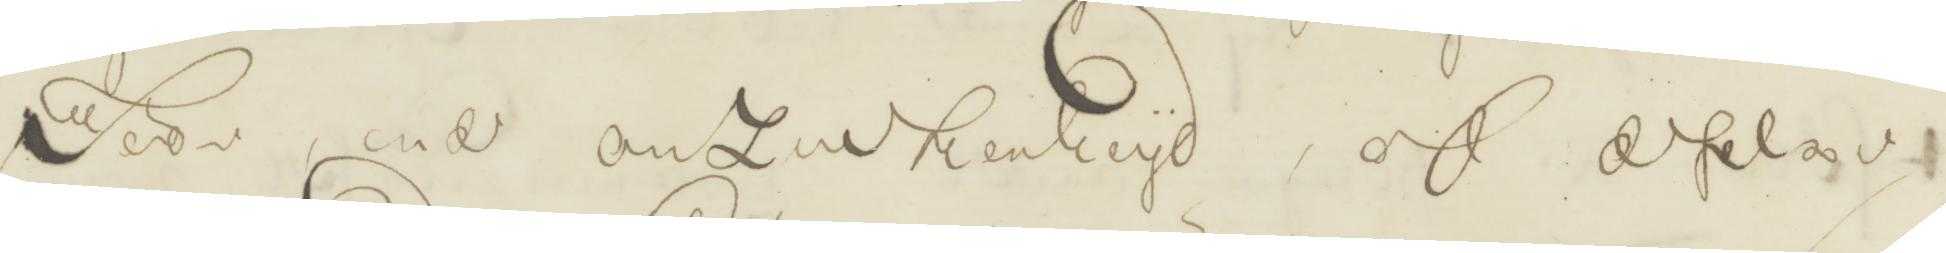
Eede, ende onzeekerheijd of deselve
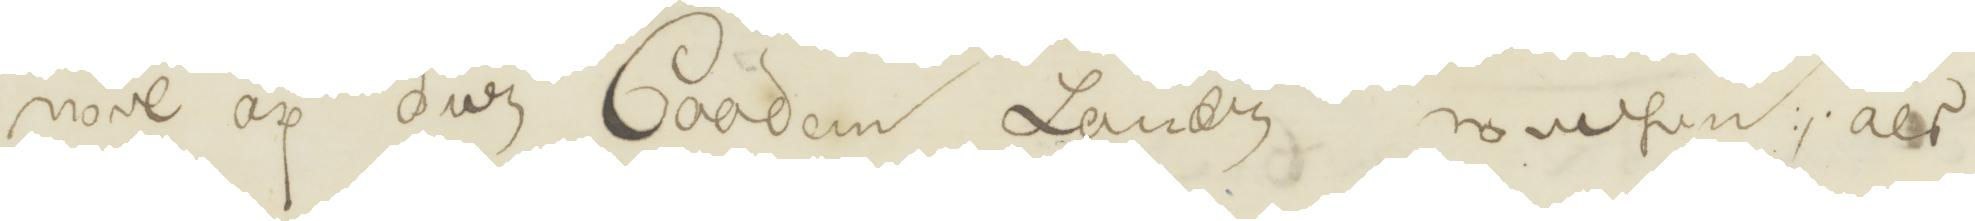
wel op dien boodem zouden weesen; als
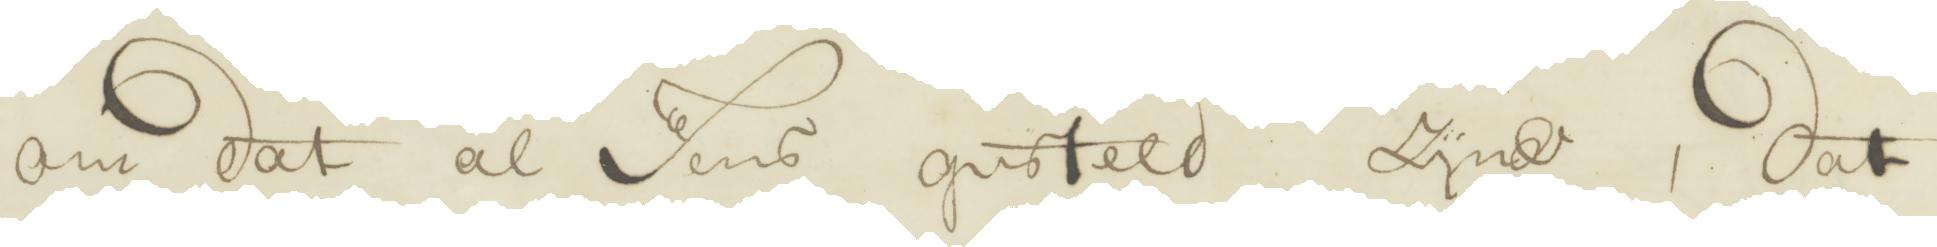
om dat al Eens gesteld zijnde, dat
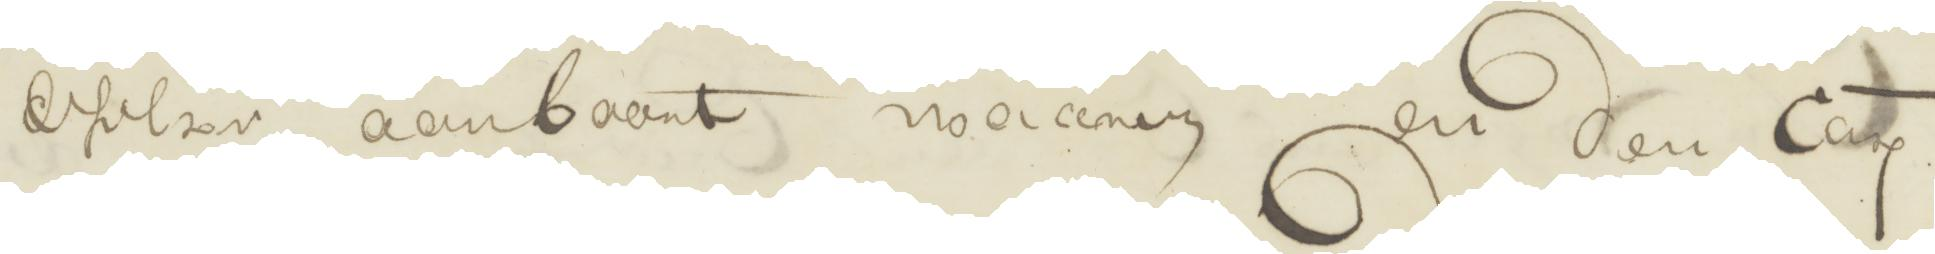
deselve aanboort waaren en den Cap
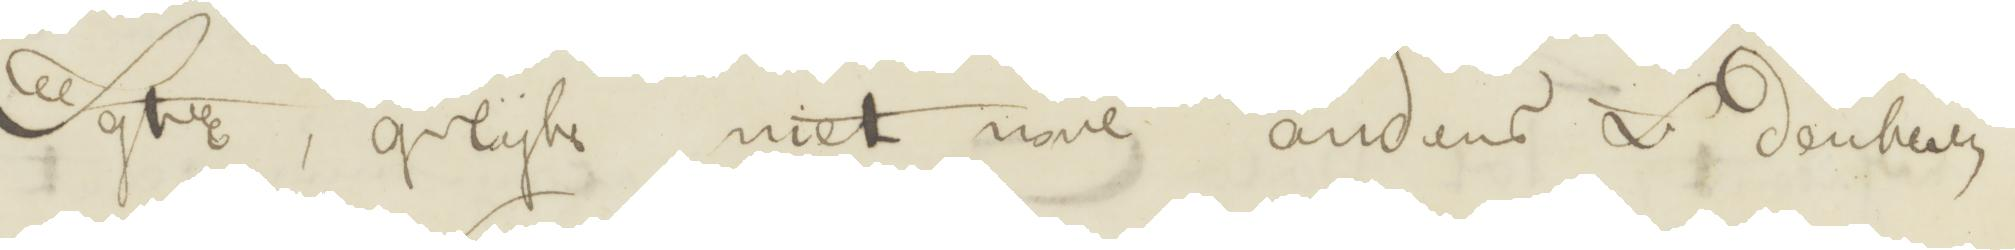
Egter, gelijk niet wel anders te denken
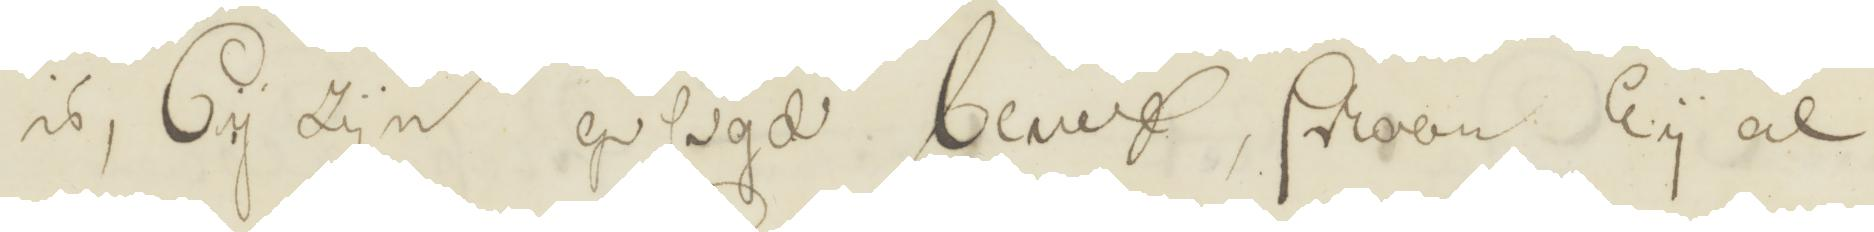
is, bij zijn gesegde bleef, schoon hij al
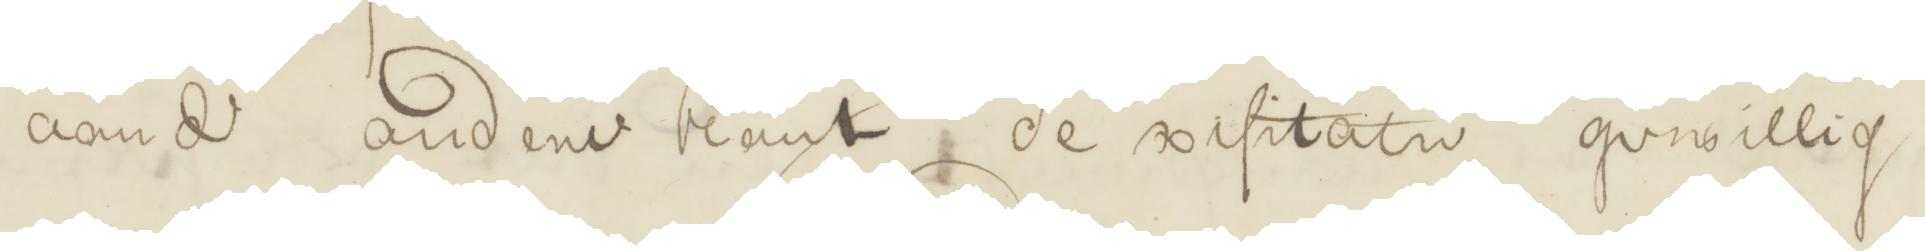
aan de andere kant de visitatie gewillig
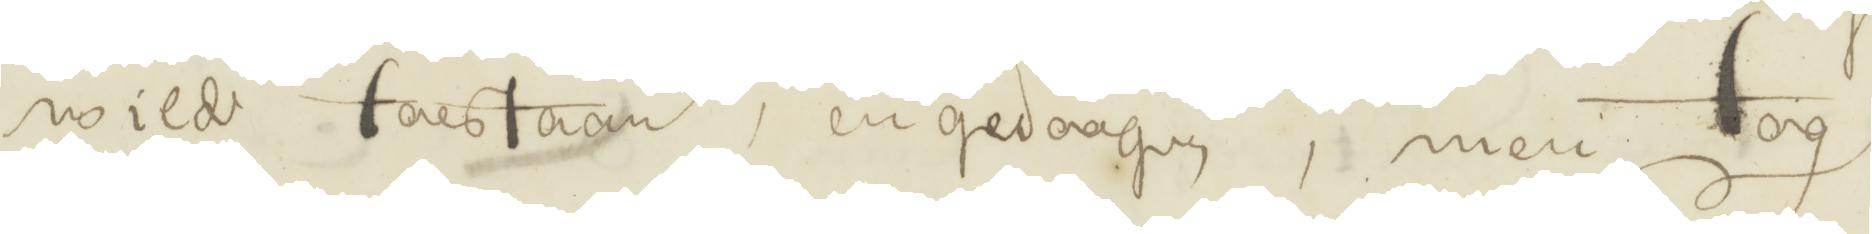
wilde toestaan, en gedoogen, men tog
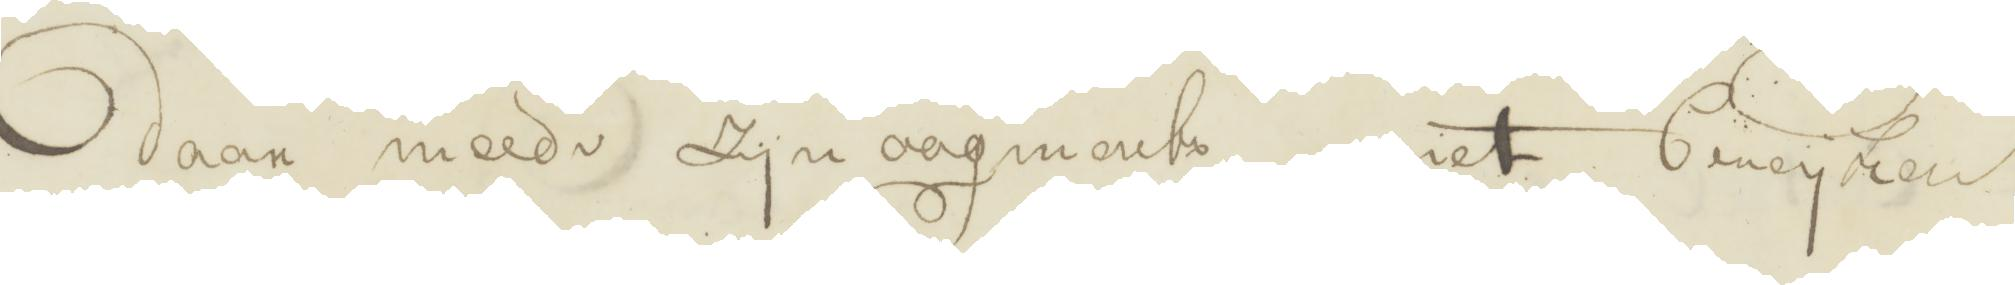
daar meede zijn oogmerk niet bereijken
